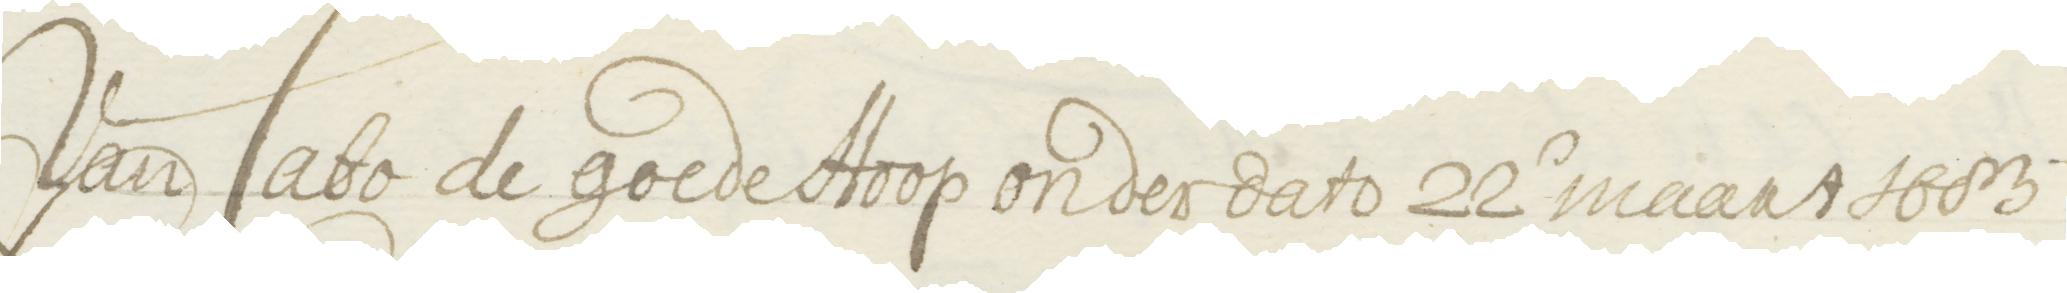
Van Cabo de goede Hoop onder dato 22' maart 1683.
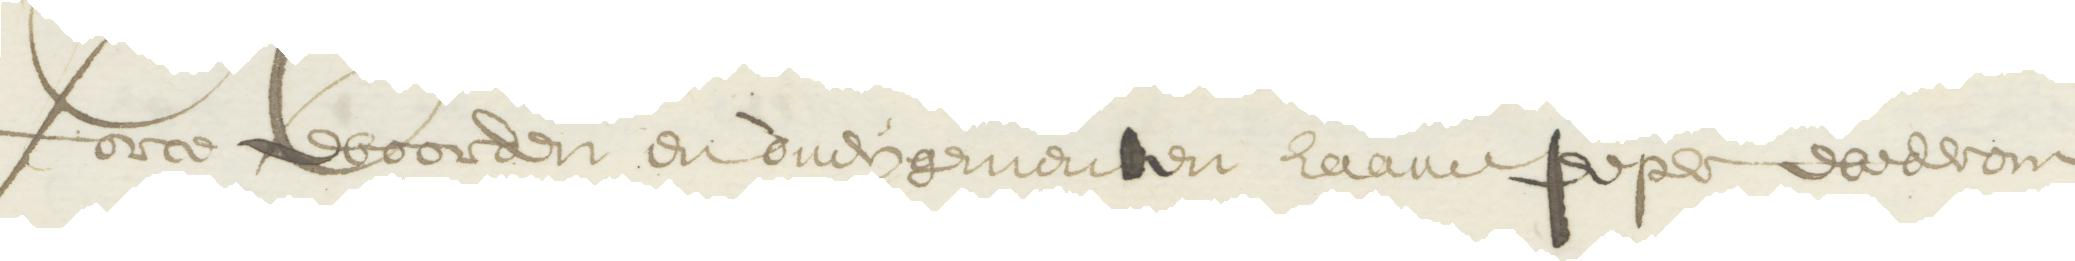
Force woorden en dreigementen haare peper wederom
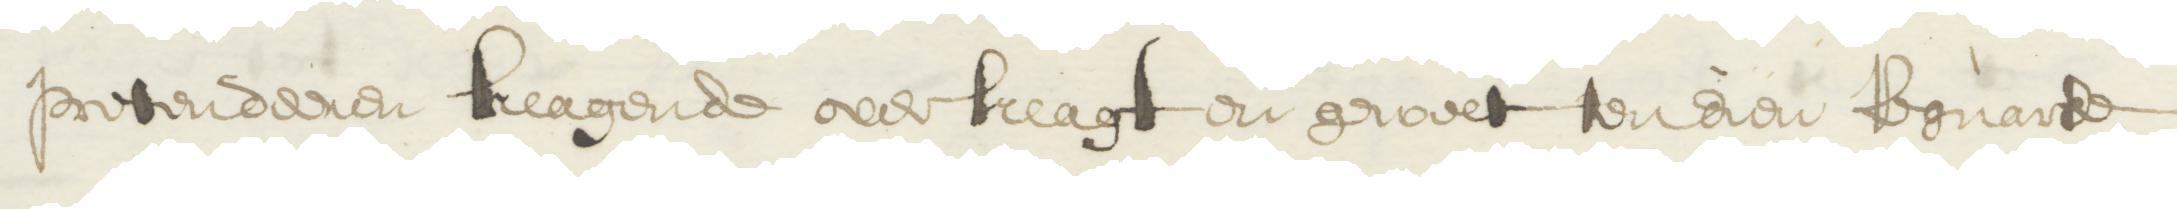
pretendeeren klagende over klagt en gewelt ten dien reguarde
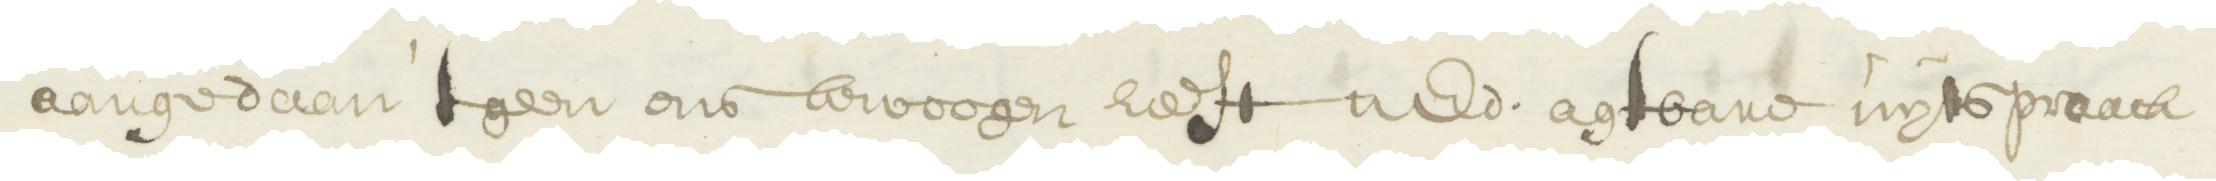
aangedaan ’tgeen ons bewoogen heeft uEd: agtbare uijtspraack
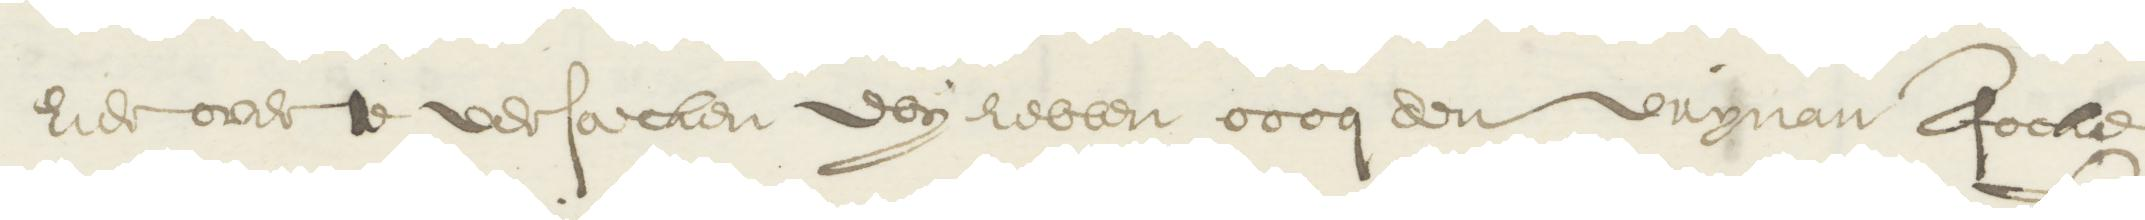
hier over te versoecken wij hebben oocq den vrijman focke
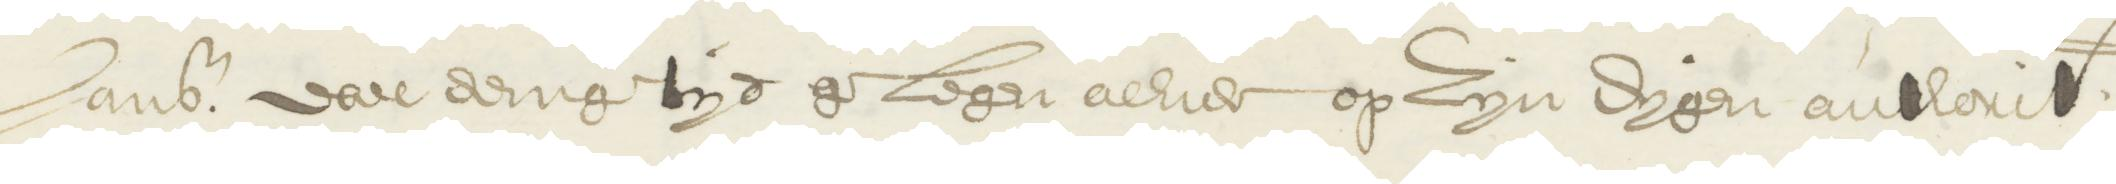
Jans.z wel eenige tijd gelegen alhier op zijn Eijgen authorit.
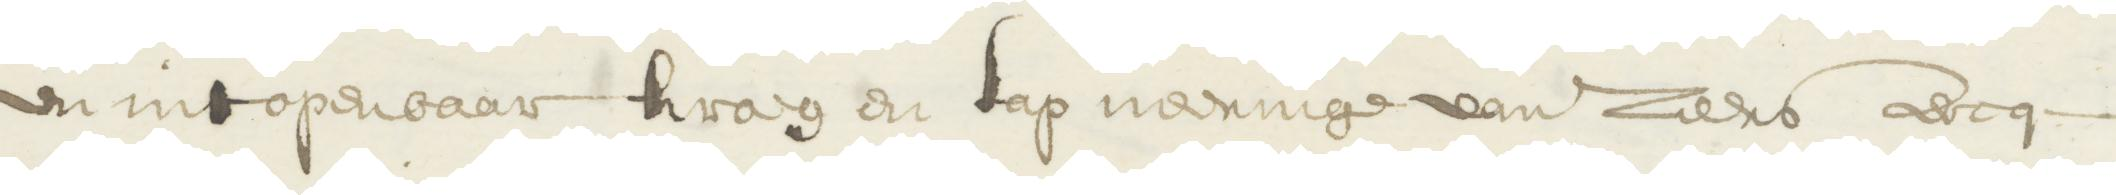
en int openbaar kroeg en tap neeringe van zulx recq
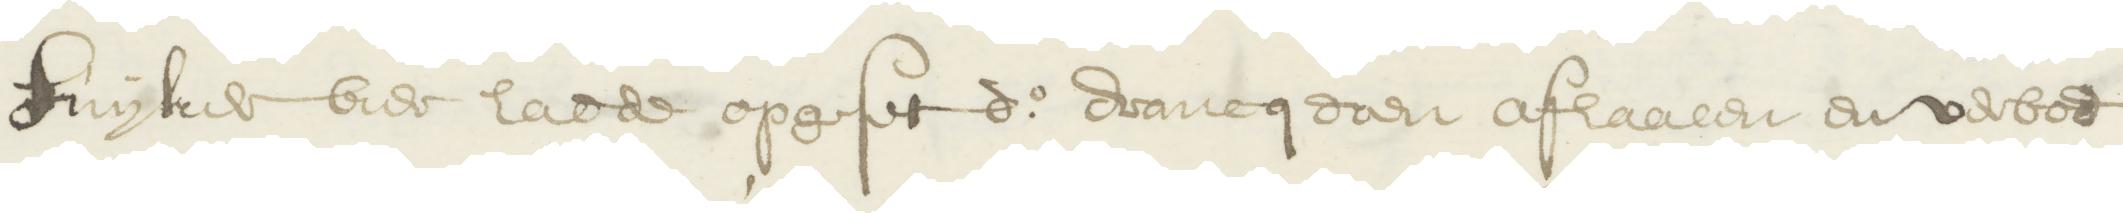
suijker hier hadde opgeset d.o drancgeven afhaalen en verbod
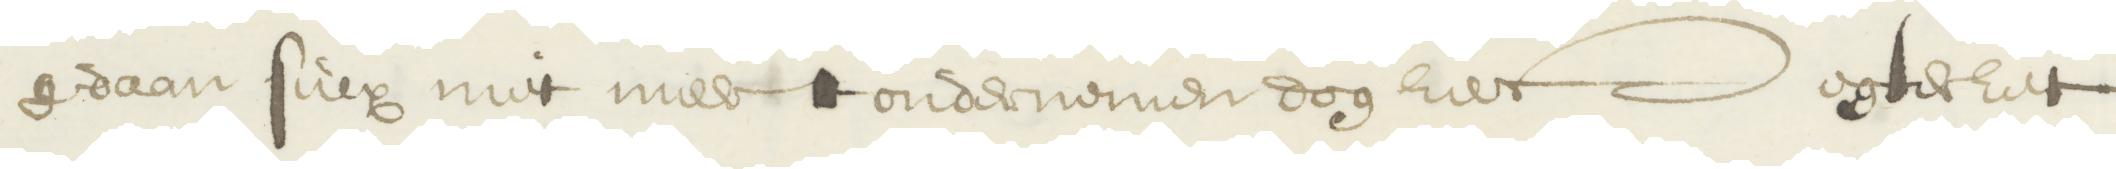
gedaan sulx niet meer ’t ondernemen dog hier egter het
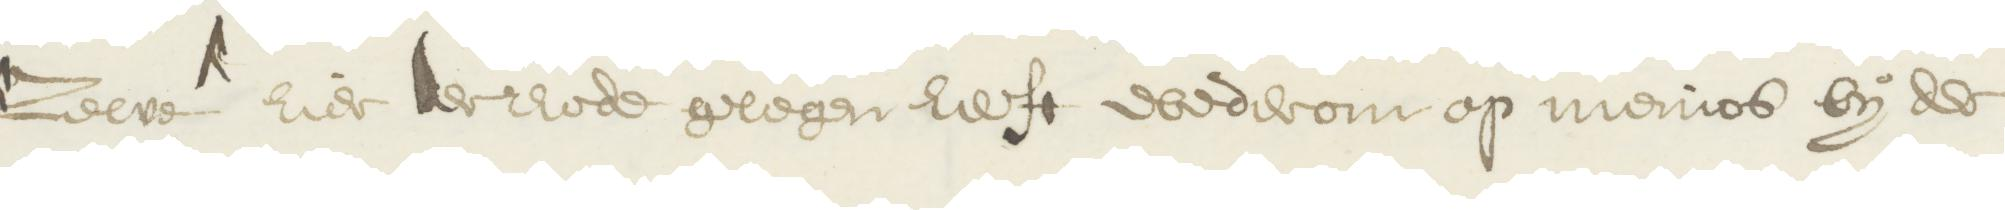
zelve hier ter rhede gelegen heeft wederom op nieuws bij der
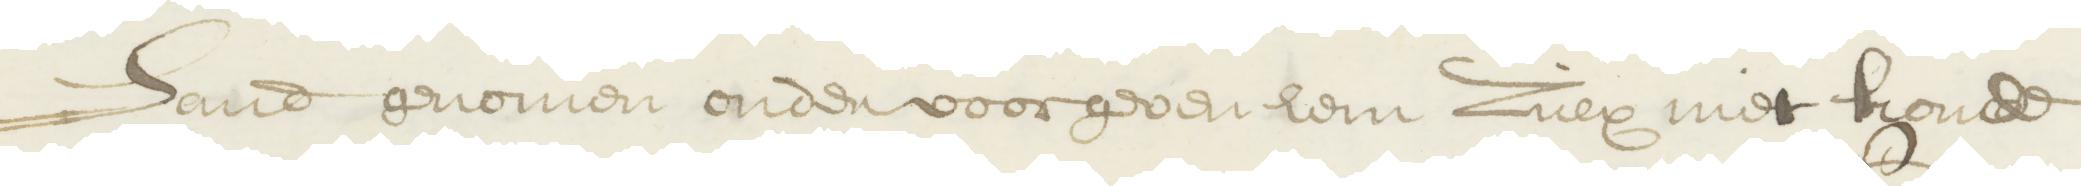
Hand genomen onder voor geven hem zulx niet konde
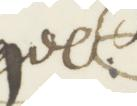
gel:
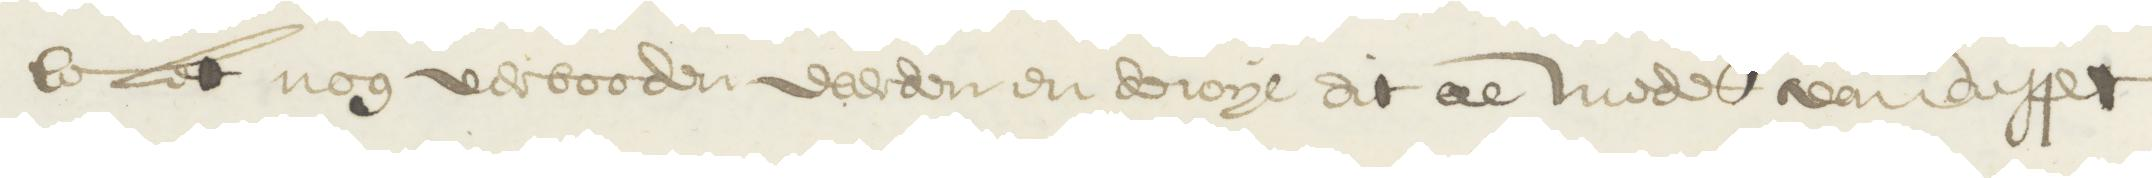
belet nog verbooden werden en dewijl dit al mede van deffet
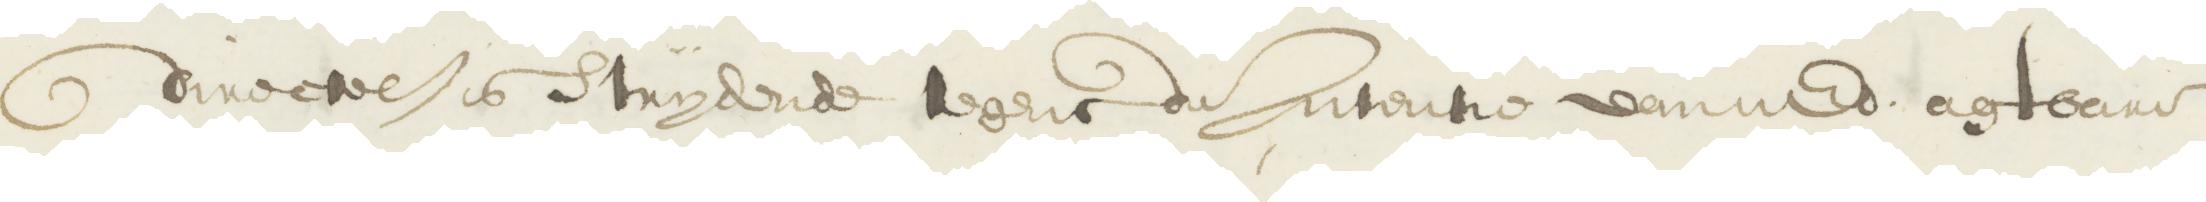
directelijk is strijdende tegens de Intentie van uEd: agtbare
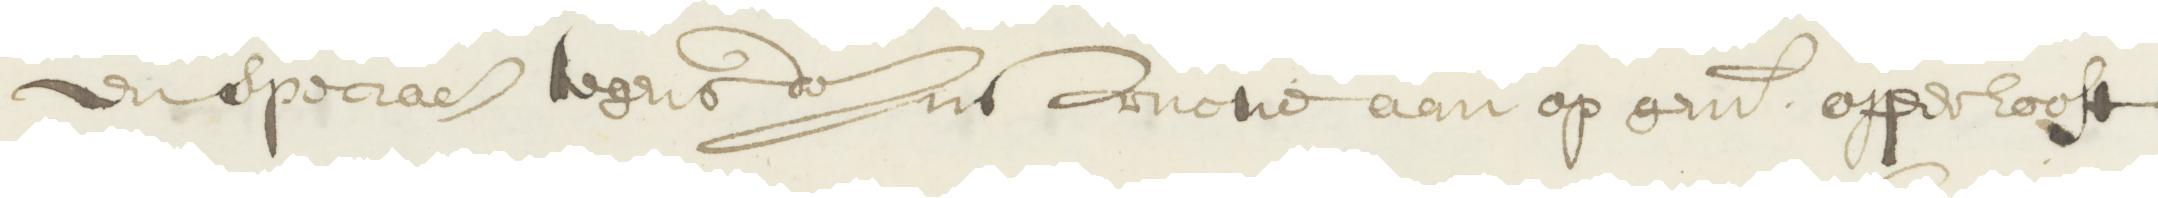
en specialijk tegens de Jnstructie aan op gem.d opperhooft
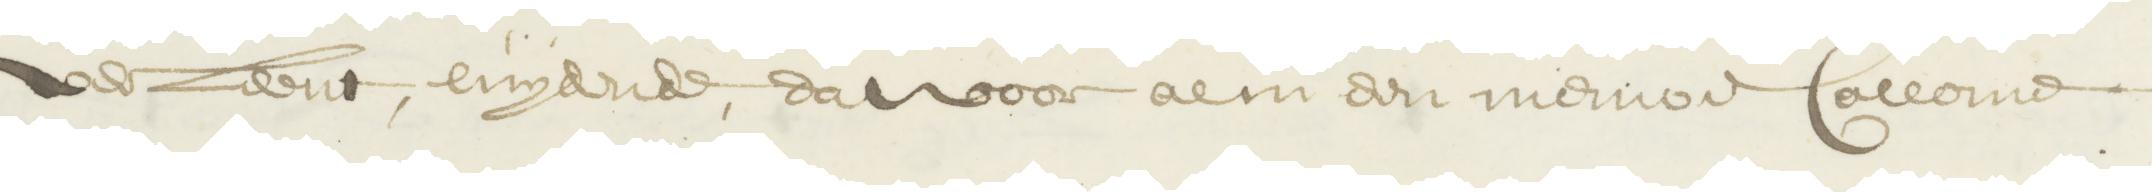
verleent, luijdende, dat voor alin den nieuwe Collonie
